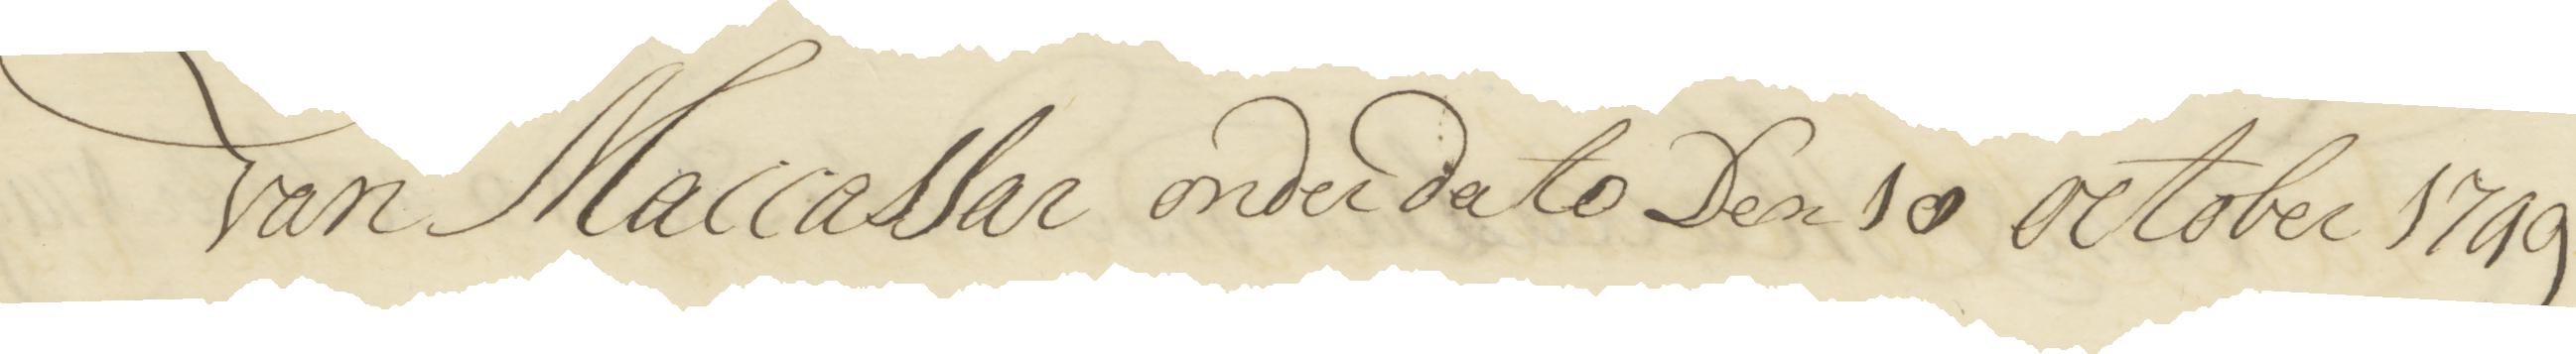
Van Maccassar onder dato Den 18 october 1749
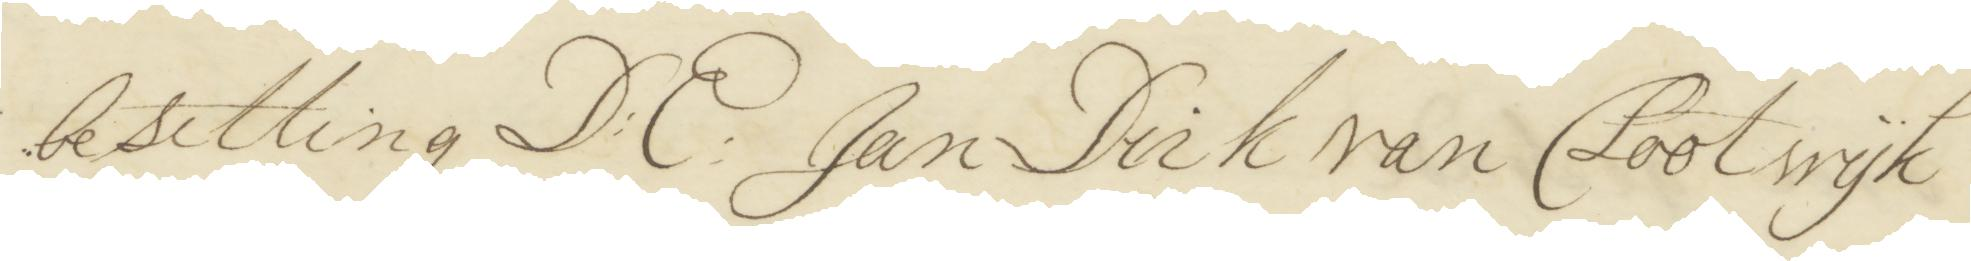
besetting D: E: Jan Dirk van Clootwijk
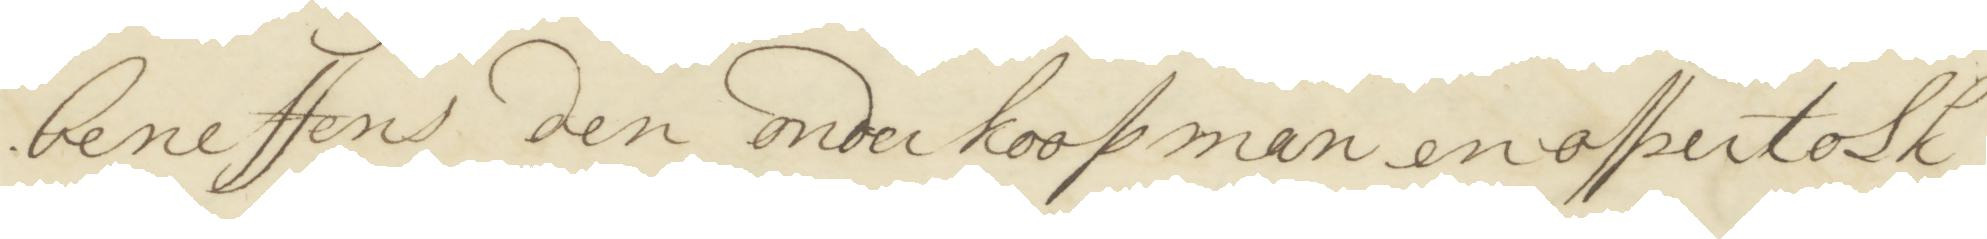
beneffens den onder koopman en oppertolk
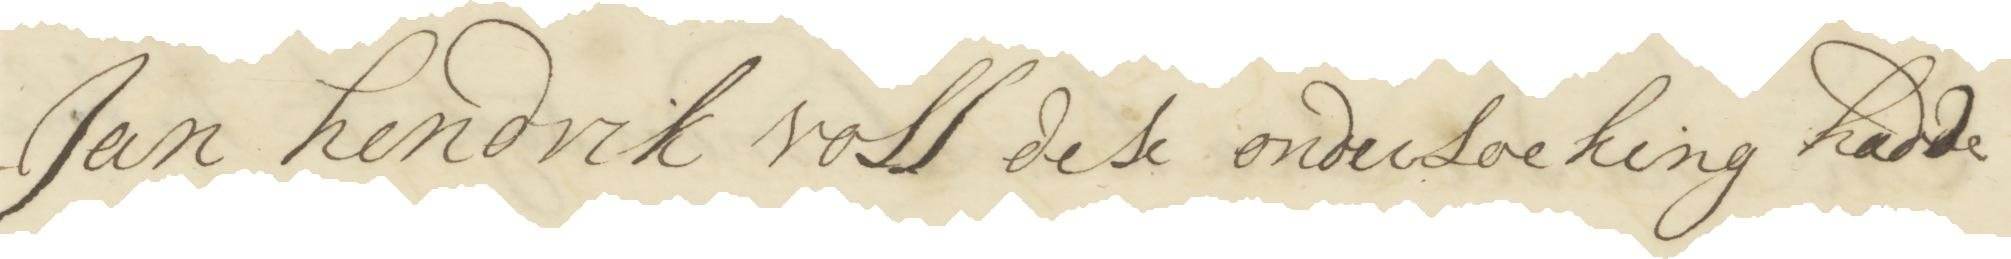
Jan hendrik voss dese ondersoeking hadde
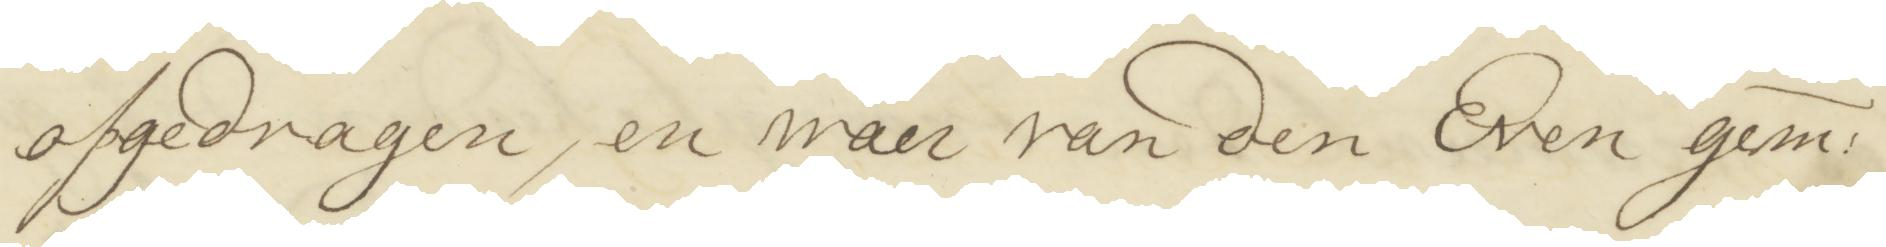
opgedragen, en waer van den Even gem:
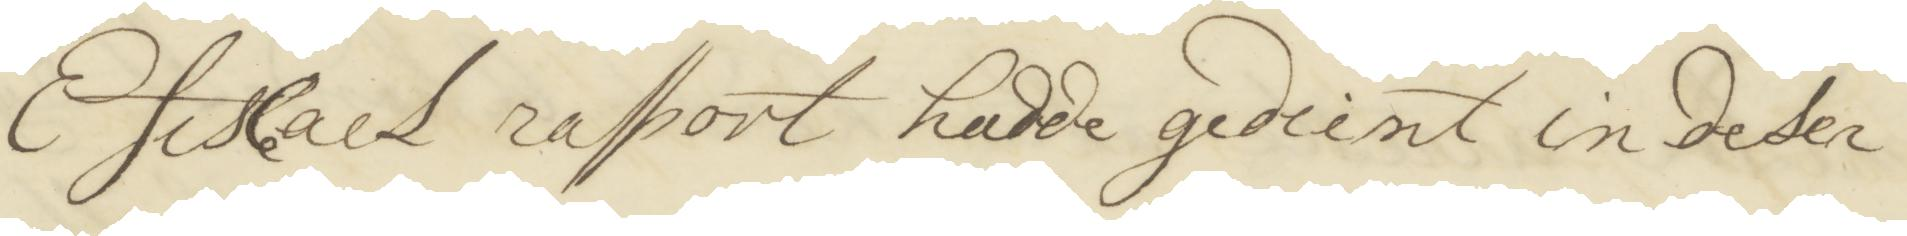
E fiscael rapport hadde gedient in deser
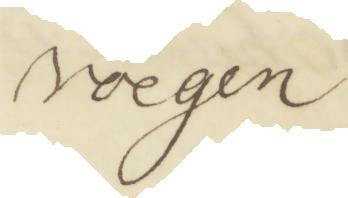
voegen
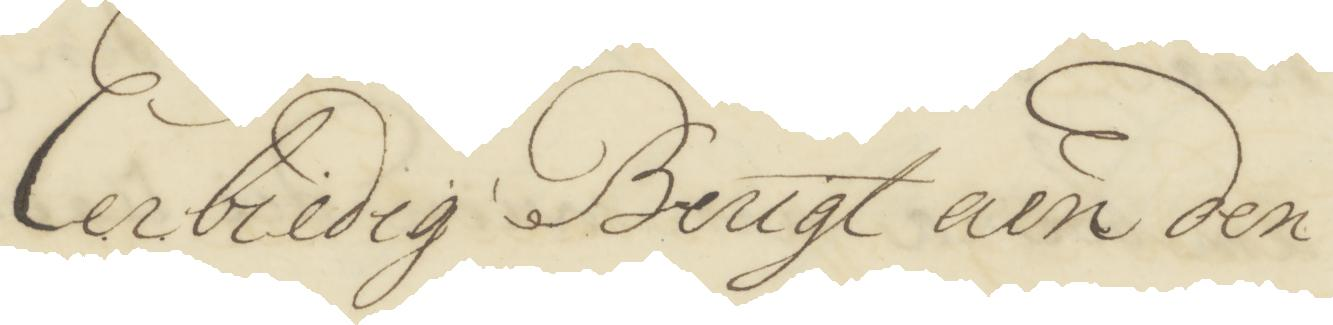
Eerbiedig Berigt aen den
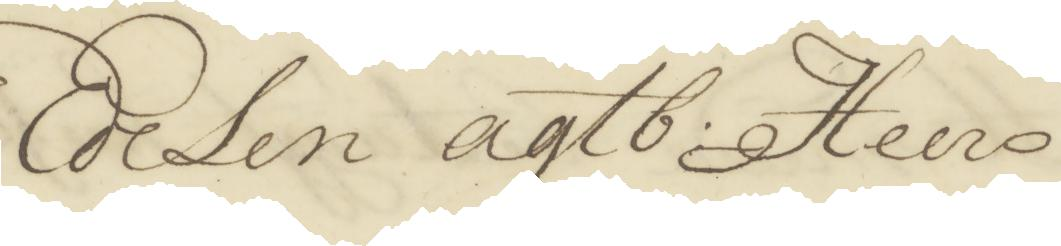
Edelen agtb: Heer
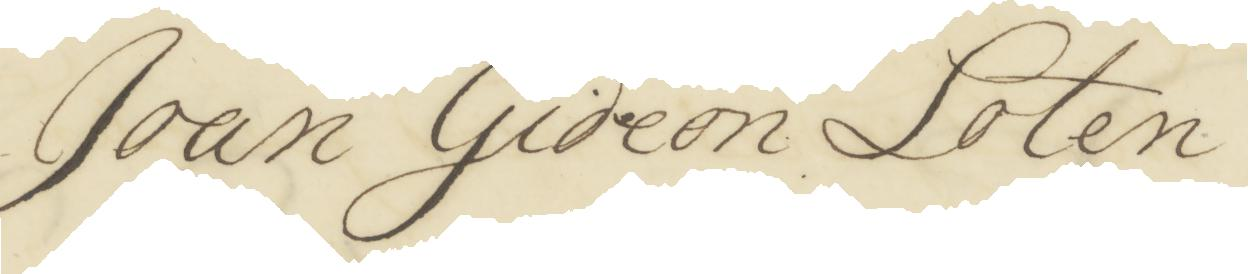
Joan Gideon Loten
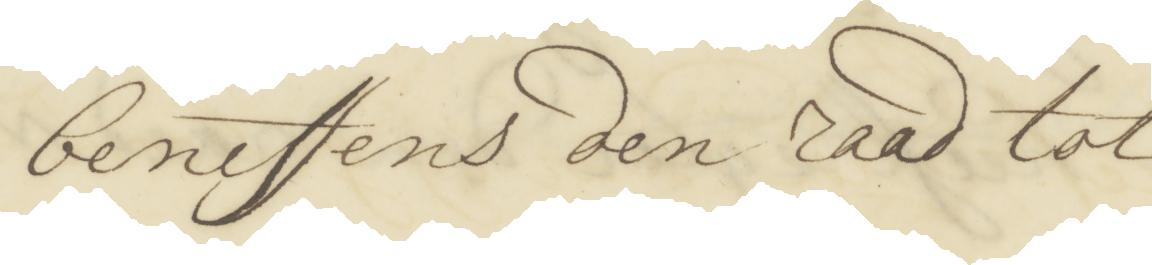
beneffens den raad tot
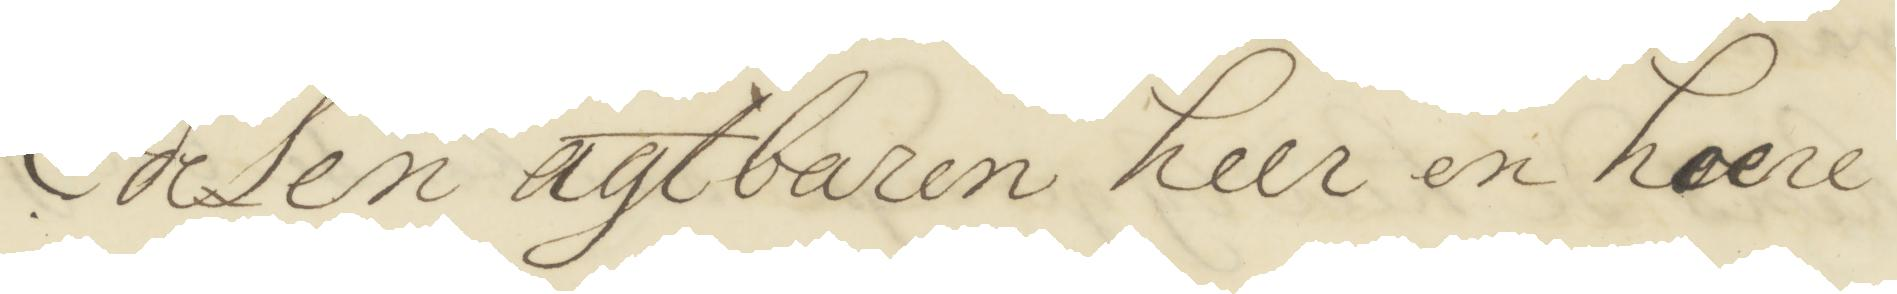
E desen agtbaren heer en heere
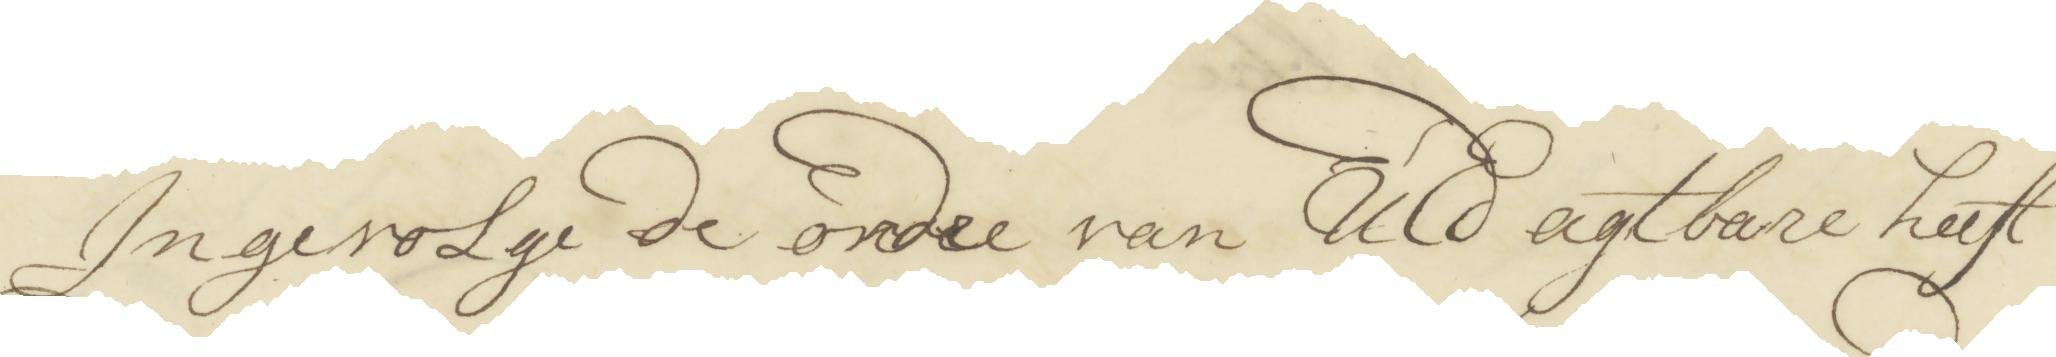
Jngevolge de ordre van UEd agtbare heeft
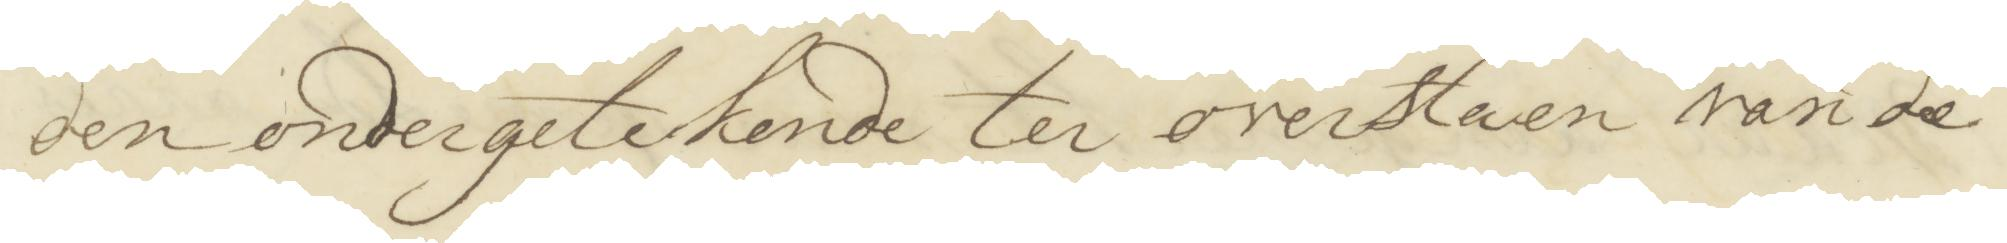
den ondergetekende ter overstaen van de
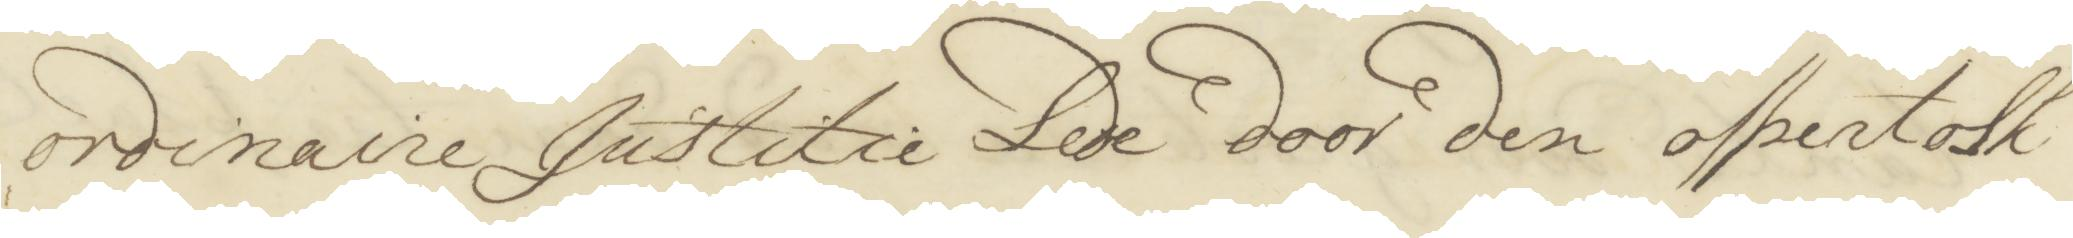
ordinaire Justitie lede door den oppertolk
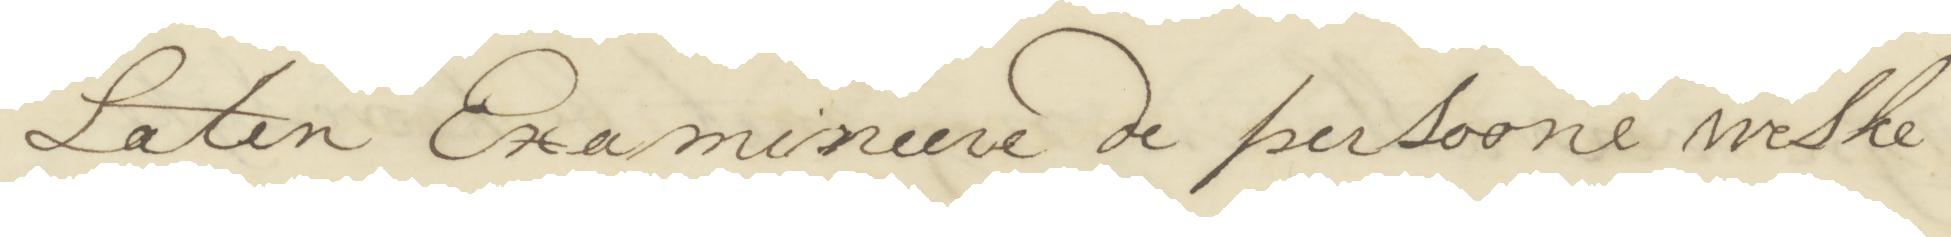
laten Examineere de persoone welke
